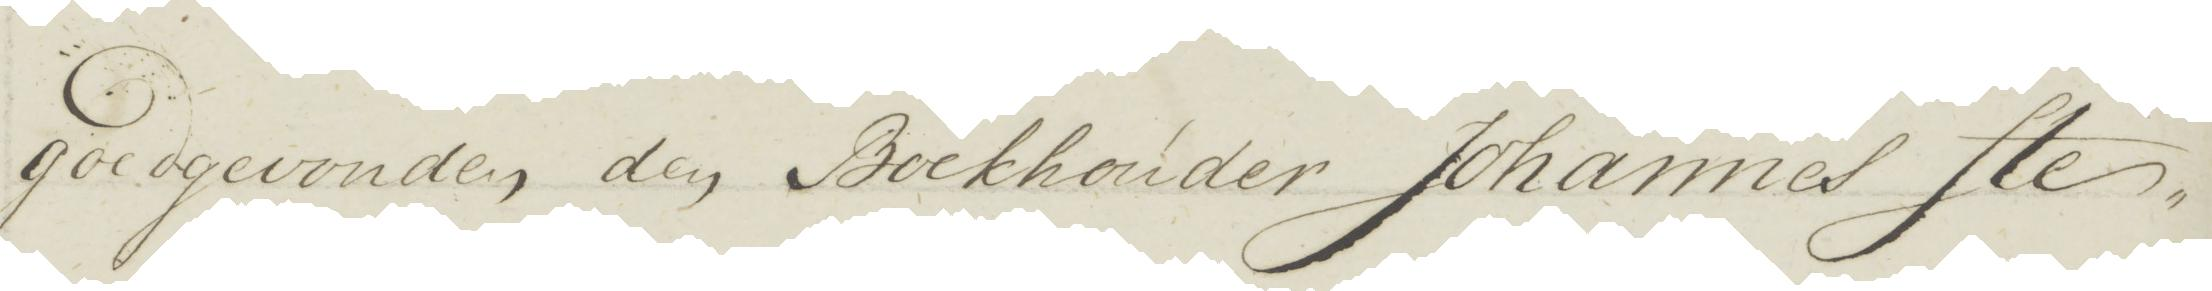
goedgevonden den Boekhouder Johannes Ste„
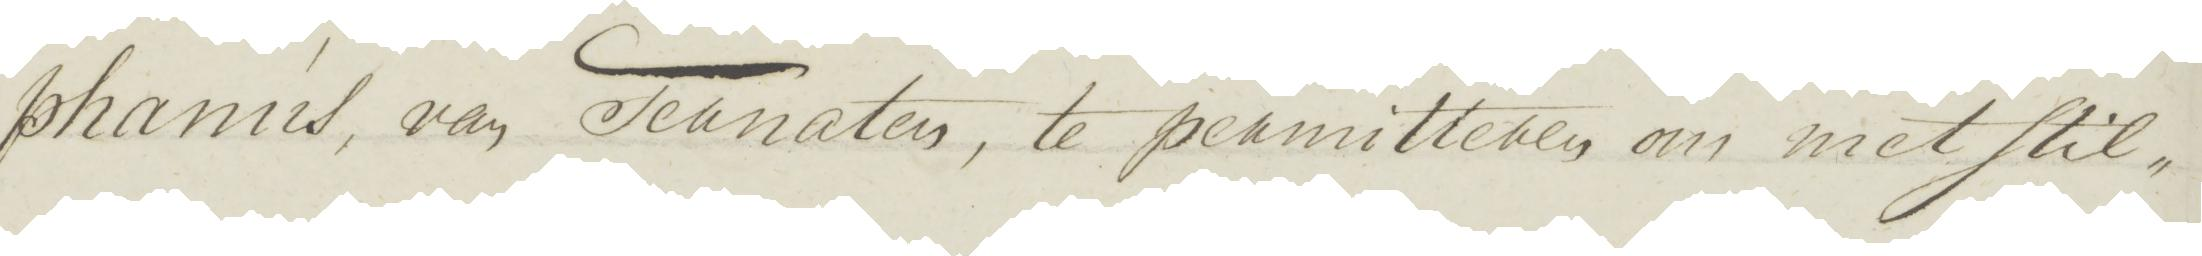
phanus, van Ternaten, te permitteren om met stil„
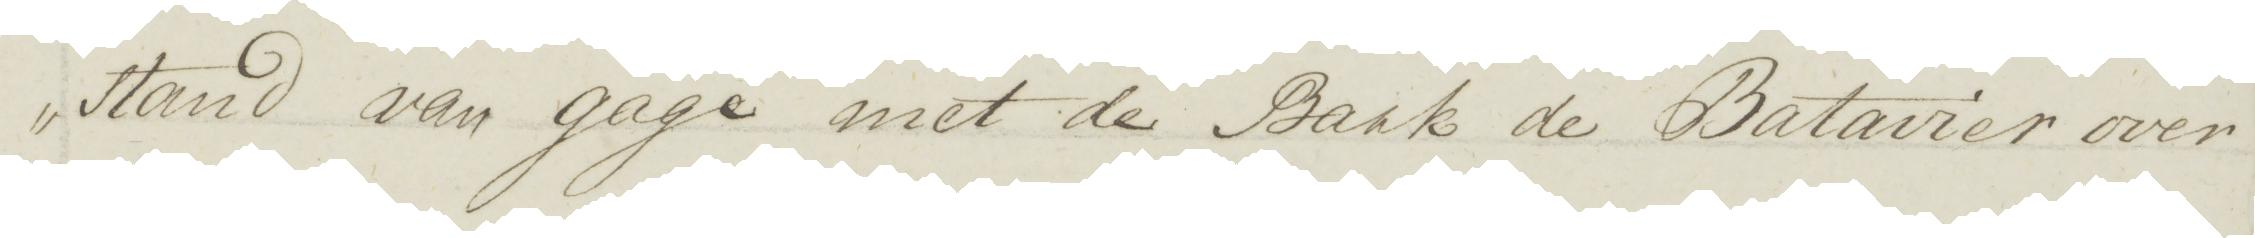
„stand van gage met de Bark de Batavier over
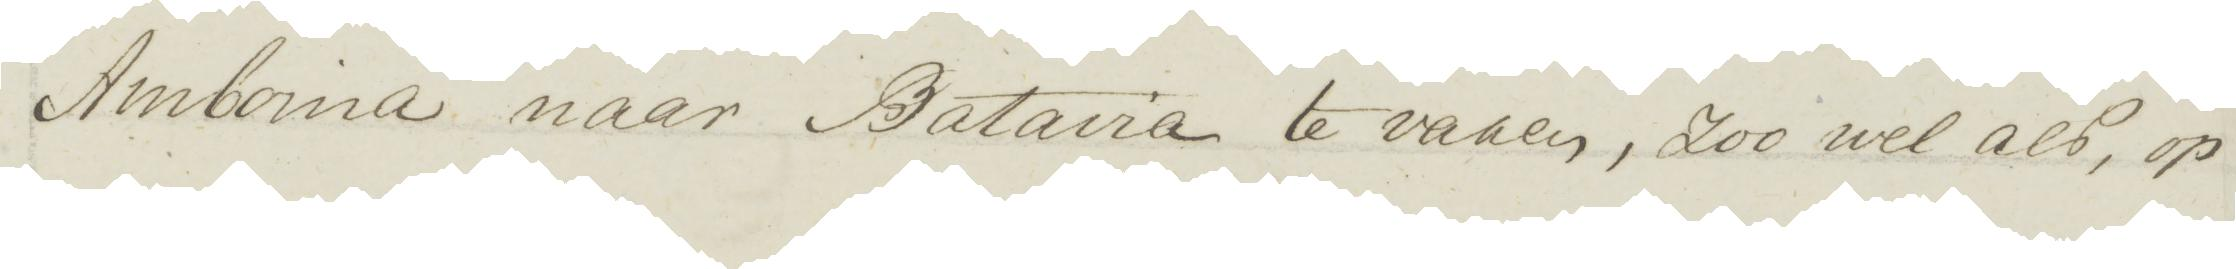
Amboina naar Batavia te varen, zoo wel als, op
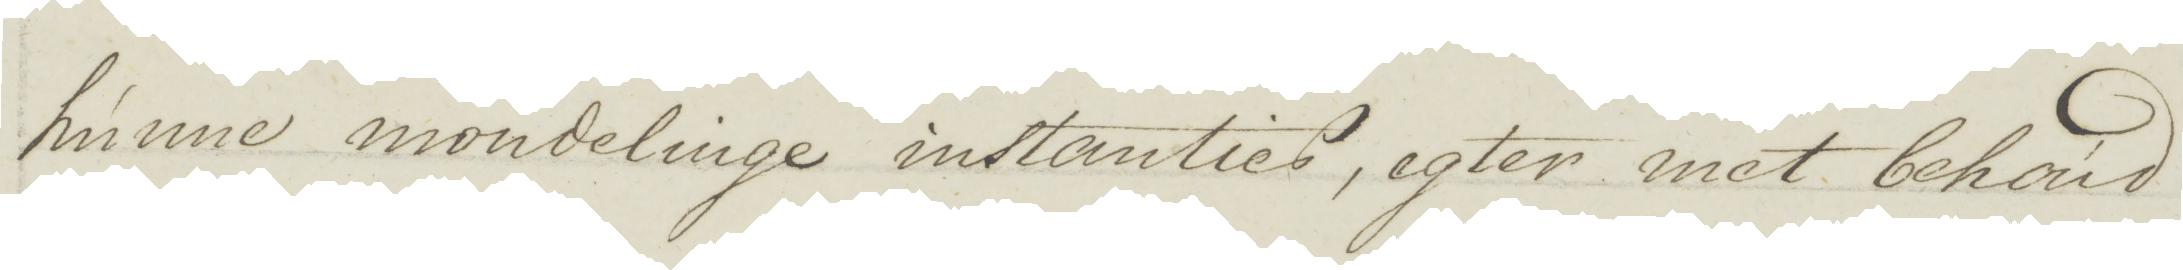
hunne mondelinge instanties, egter met behoud
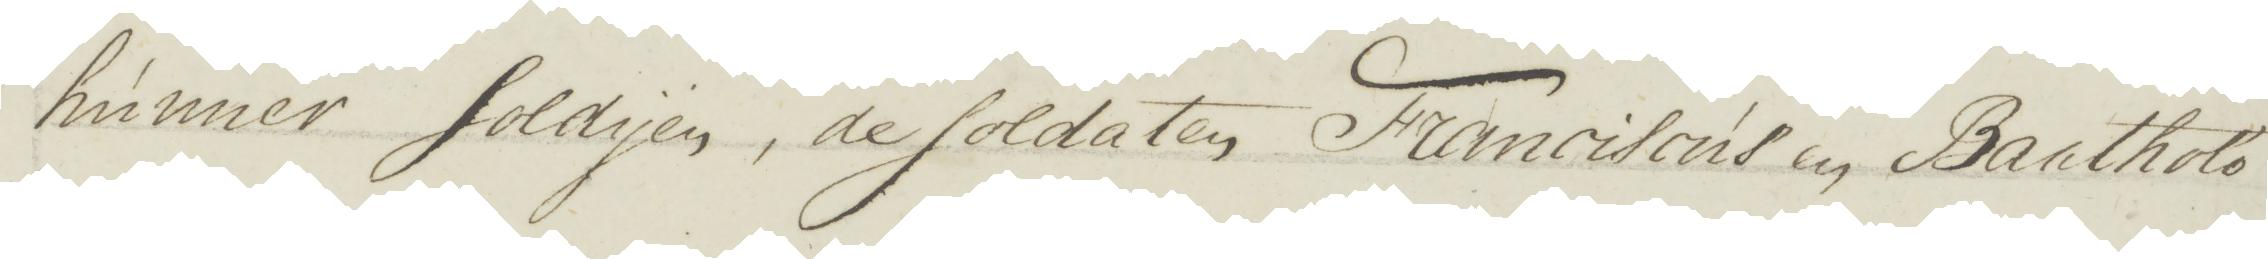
hunner soldijen, de soldaten Franciscus en Bartholo„
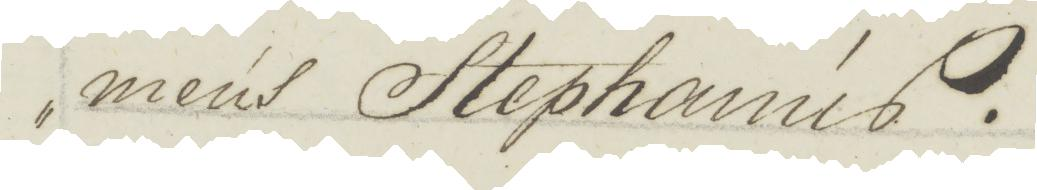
„meus Stephanus.
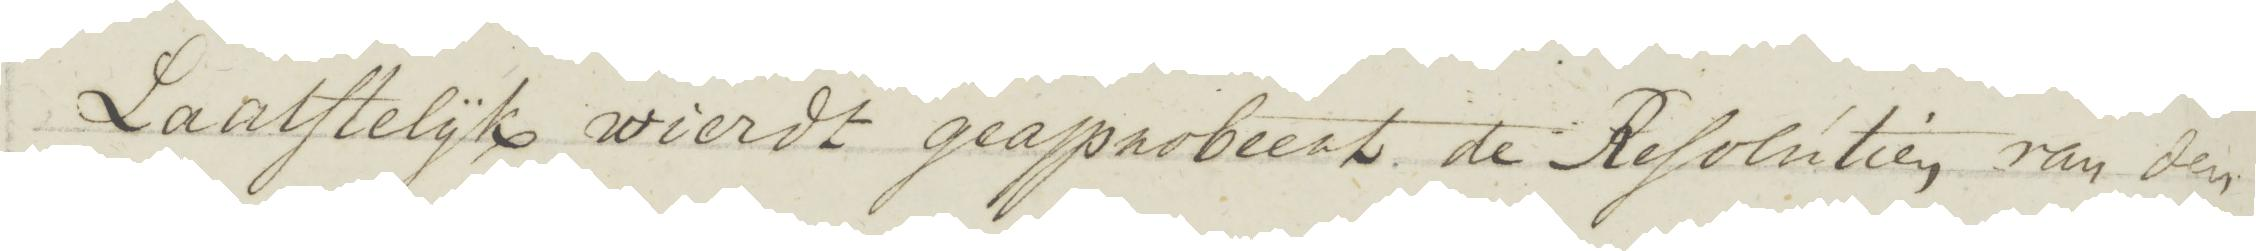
Laatstelijk wierdt geapprobeert de Resolutien van den
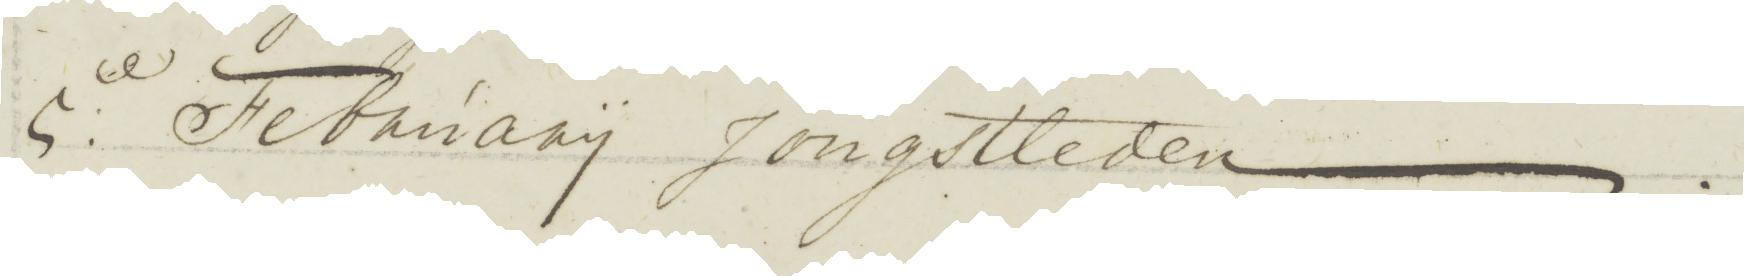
5:e Februarij Jongstleden.
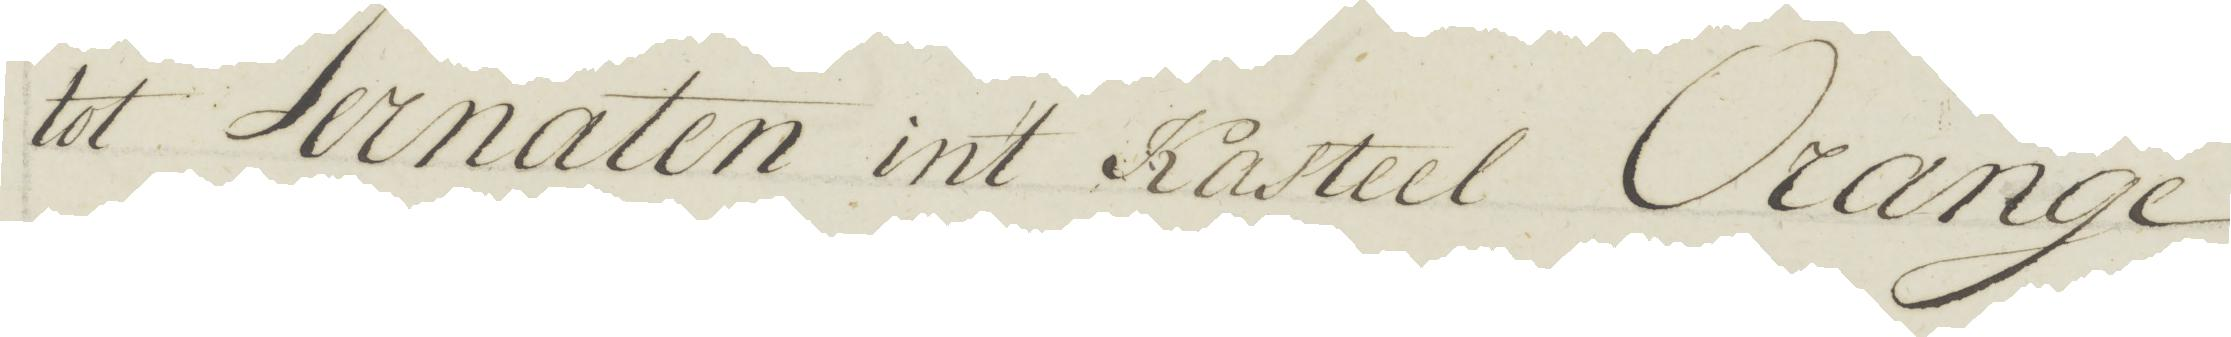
tot Ternaten in’t Kasteel Orange
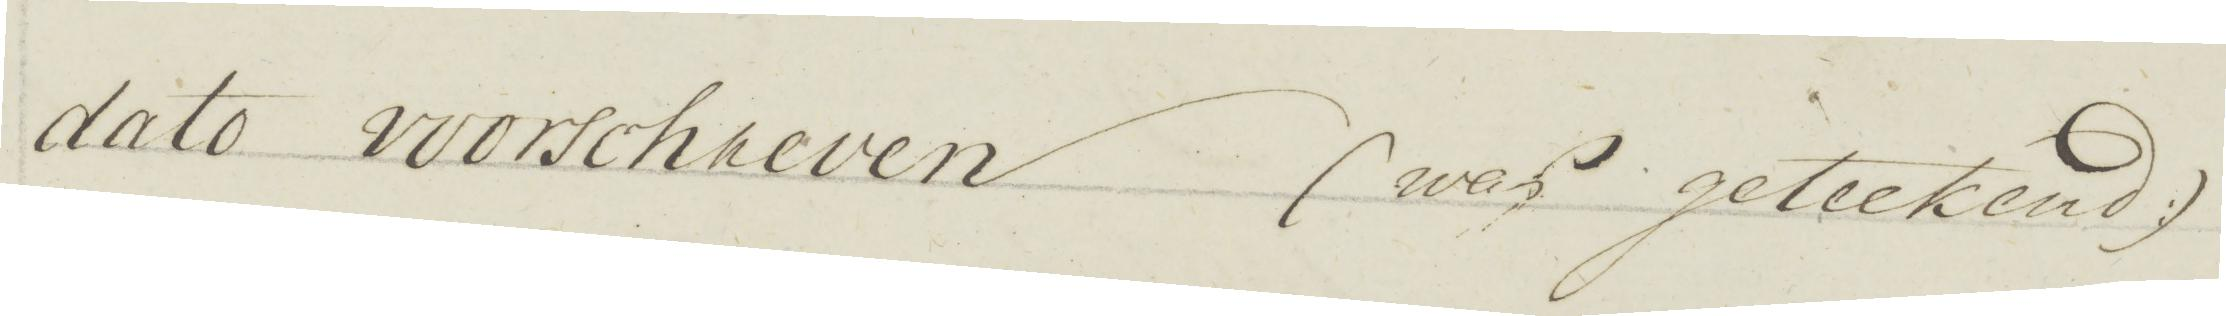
dato voorschreven ( was geteekend :)
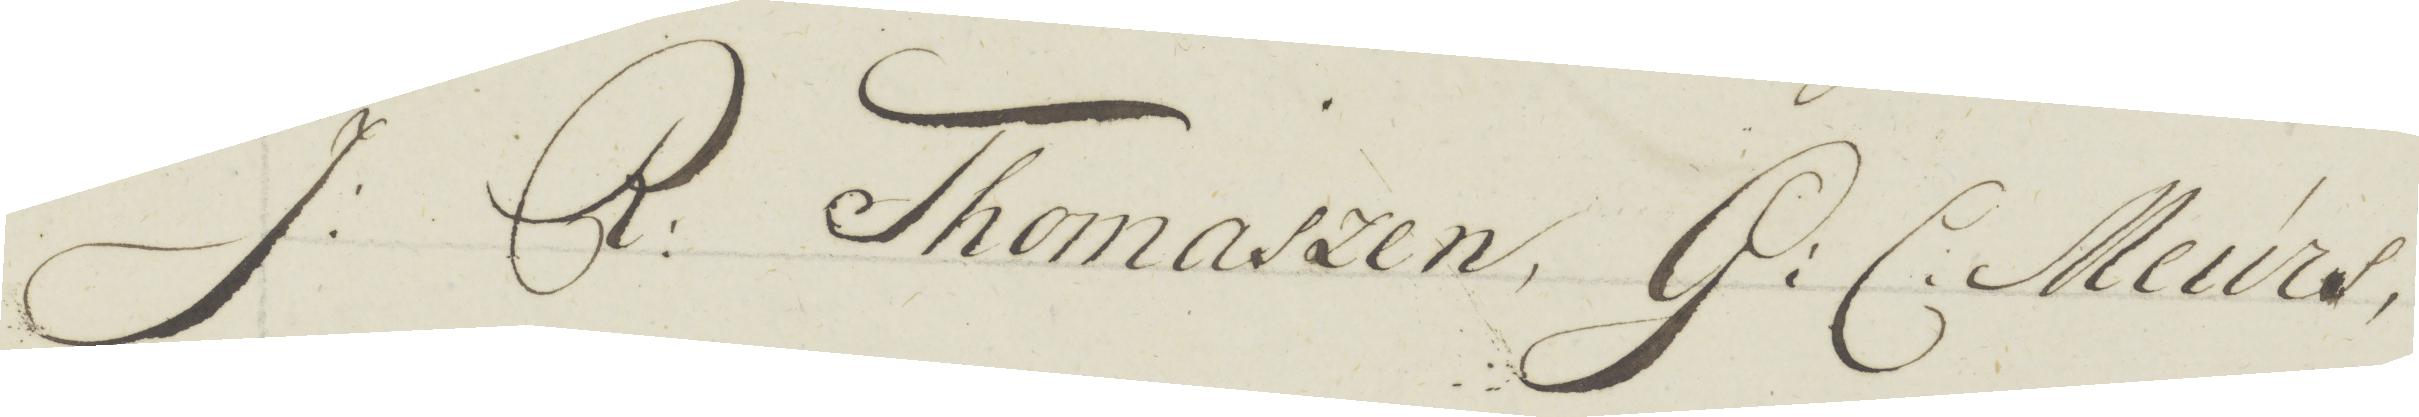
J: R: Thomaszen, G: C: Meurs,
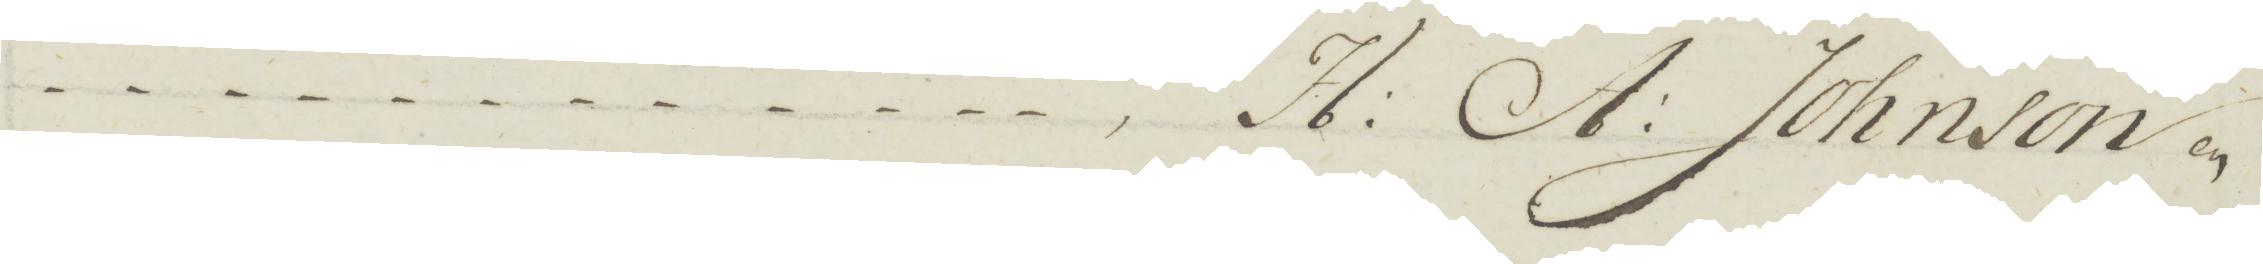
- - - - - - - - - - - - , H: A: Johnson en
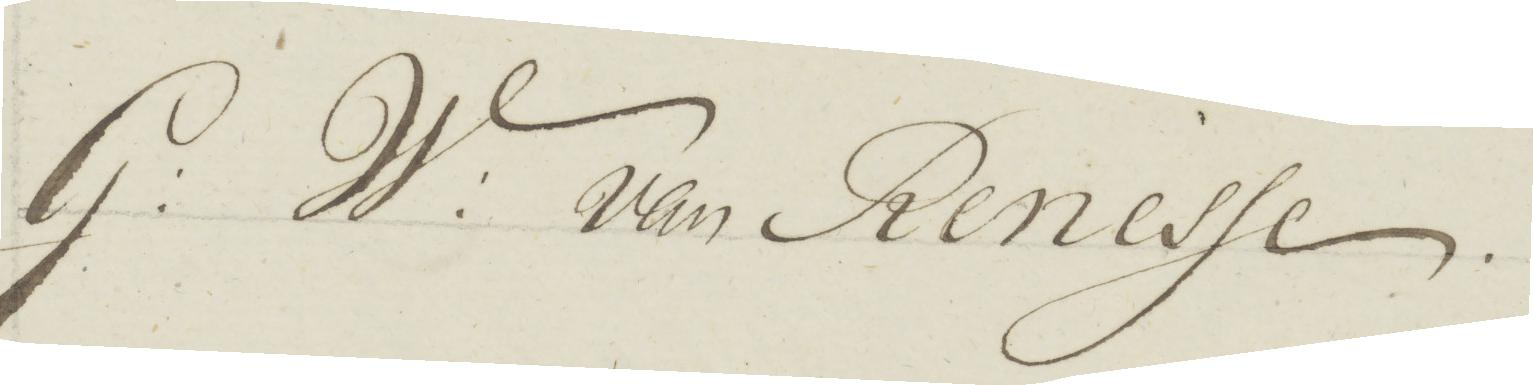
G: W: van Renesse.
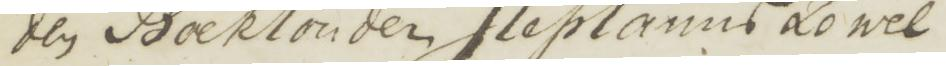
den Boekhouder Stephanus zo wel
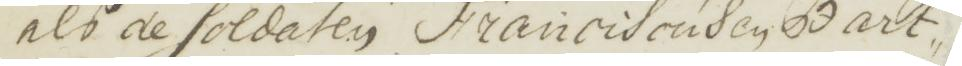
als de soldaten Franciscus en Bart„
